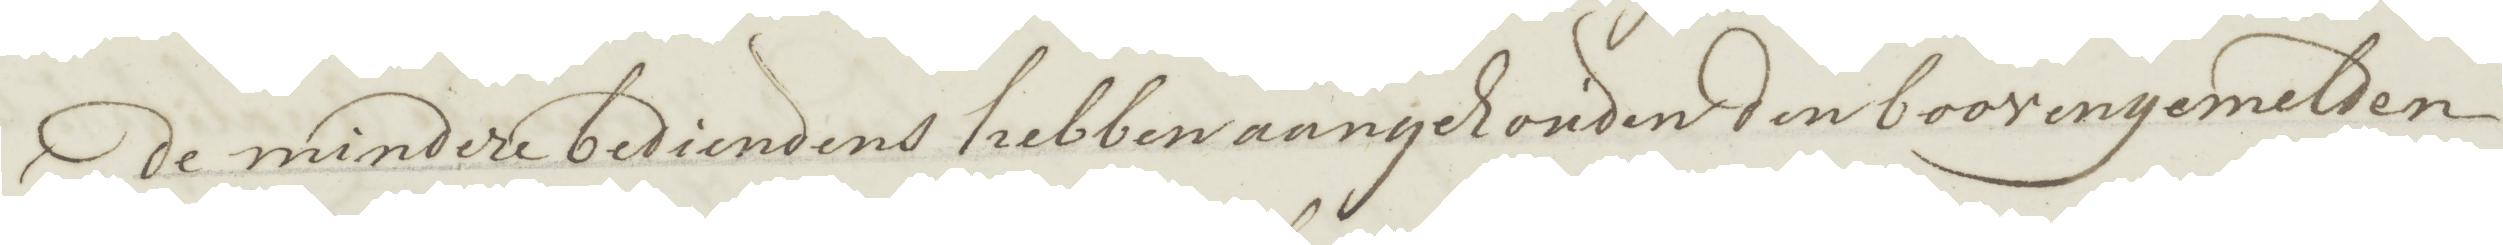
de mindere bediendens hebben aangehouden den boovengemelden
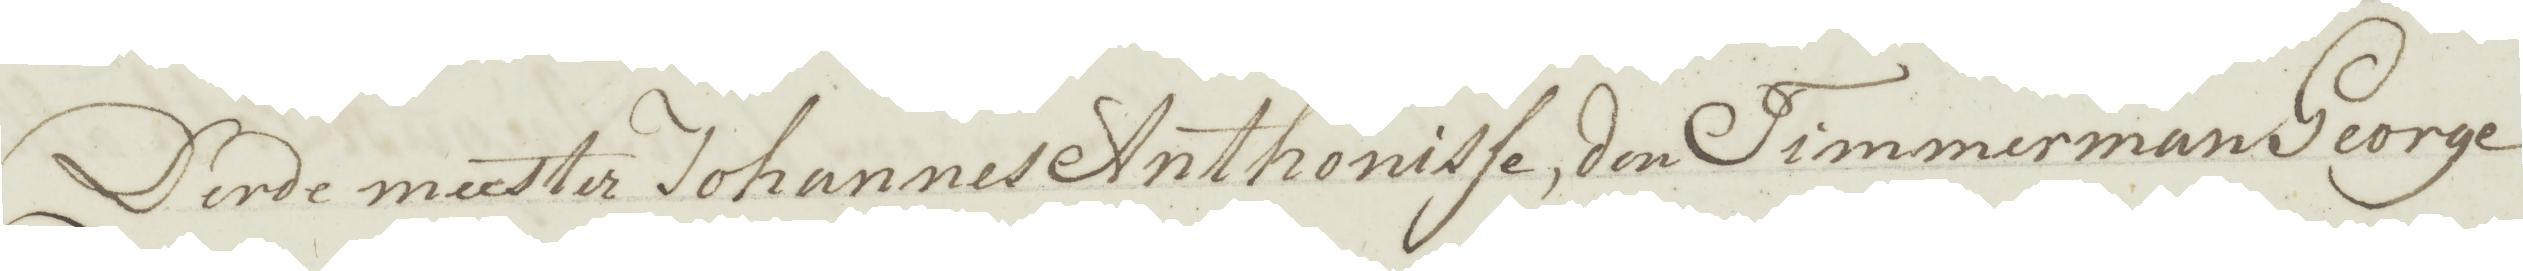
Derde meester Iohannes Anthonisse, den Timmerman George
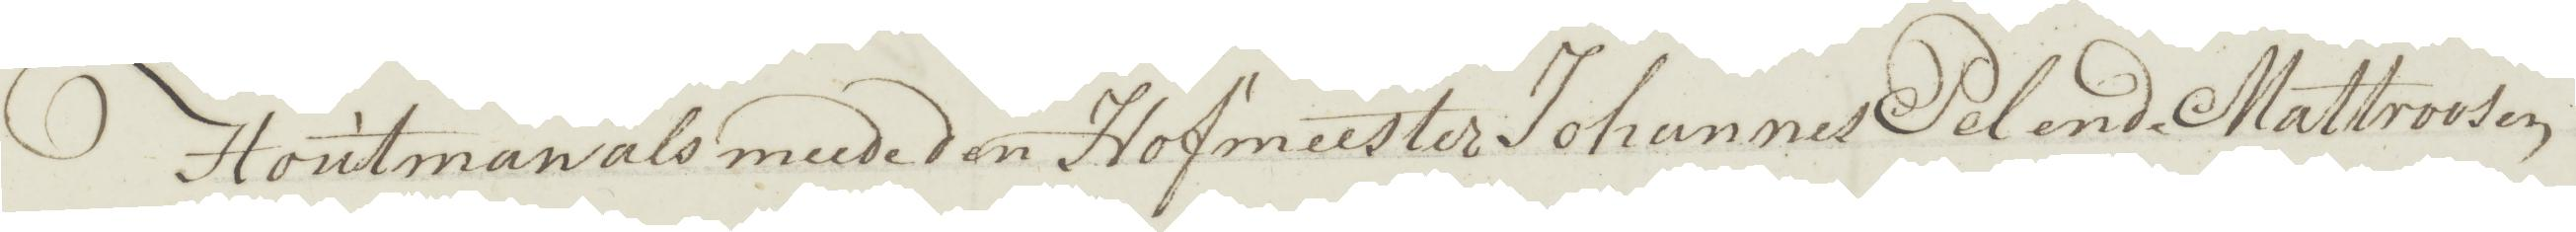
Houtman als meede den Hofmeester Iohannes Pel ende Mattroosen
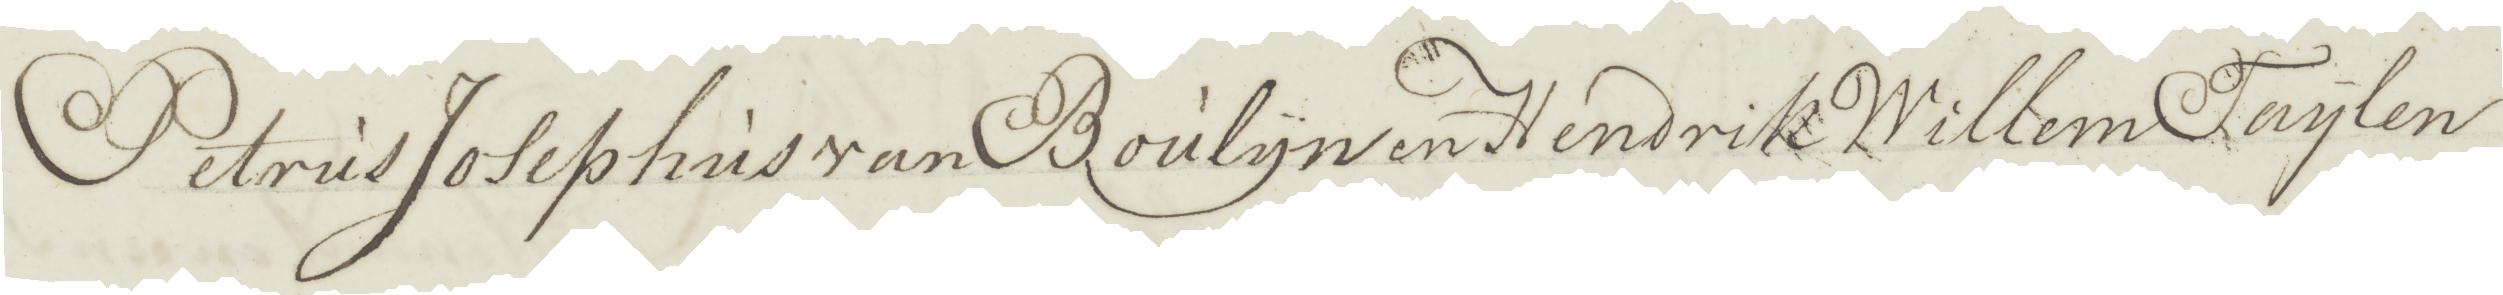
Petrus Josephus van Boulijn en Hendrik Willem Taijlen
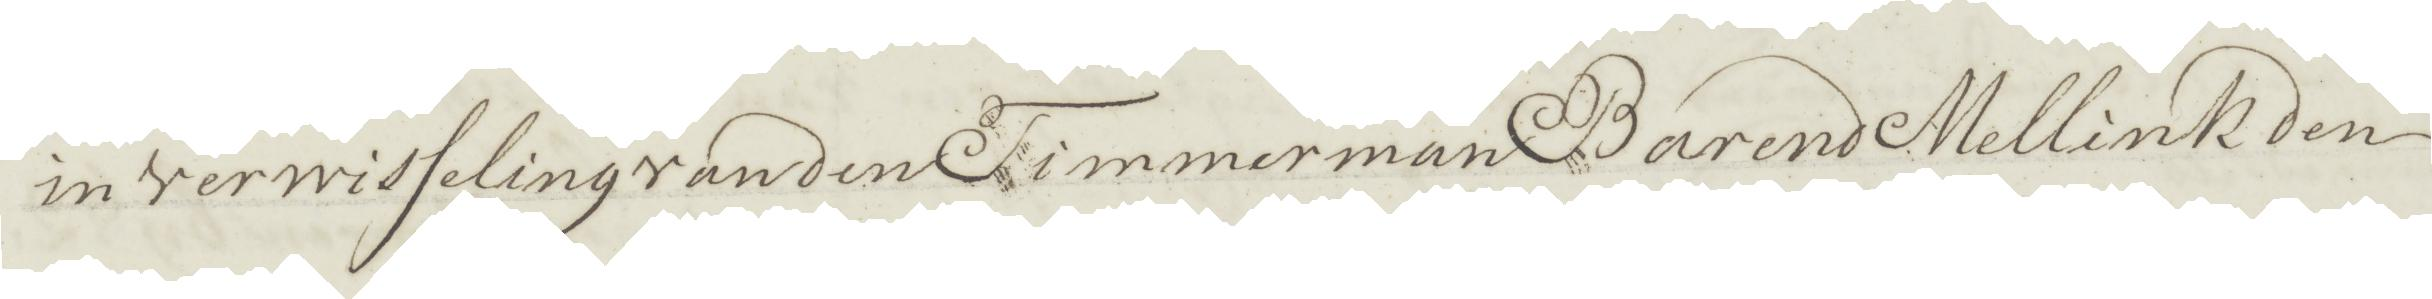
in verwisseling van den Timmerman Barend Mellink den
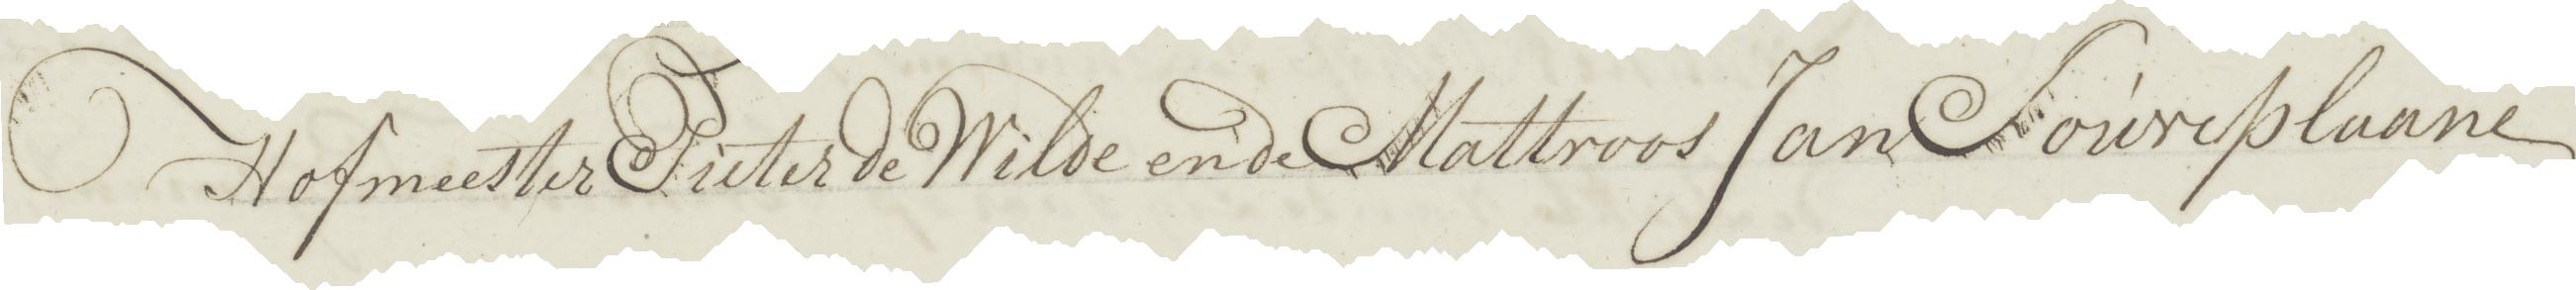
Hofmeester Pieter de Wilde en de Mattroos Jan Souveplaane
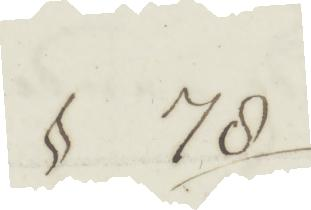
§ 78
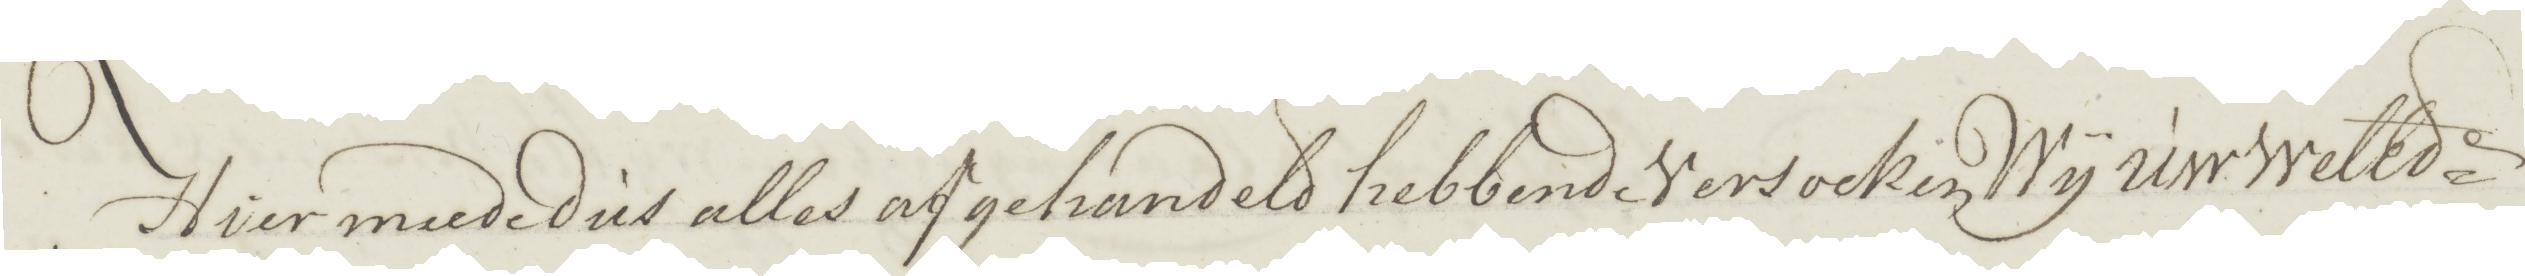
Hier meede dus alles afgehandeld hebbende versoeken Wij uw wel Ed=e
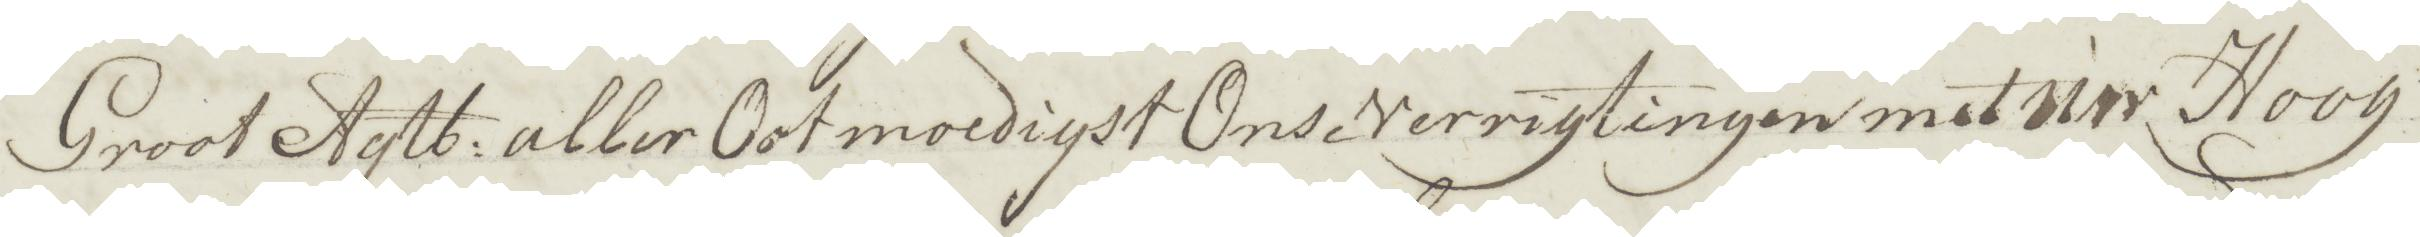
Groot Agtb: aller Ootmoedigst Onse verrigtingen met uw Hoog
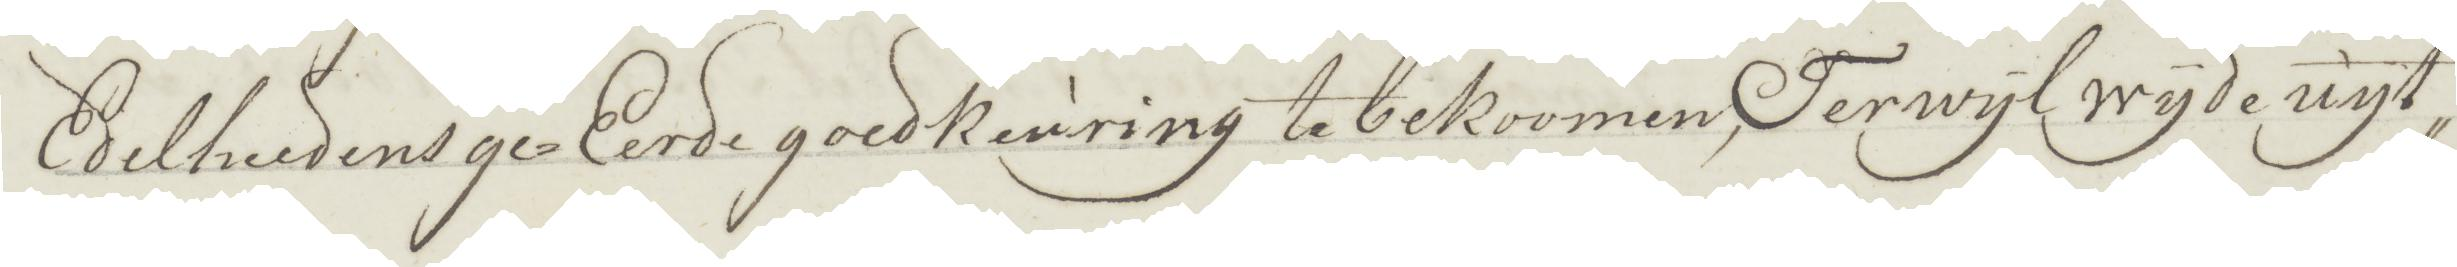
Edelheedens ge= Eerde goed keuring te bekoomen, Terwijl wij de uijt„
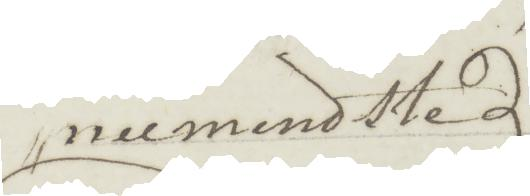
„neemendste
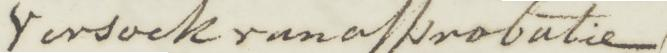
Versoek van approbatie
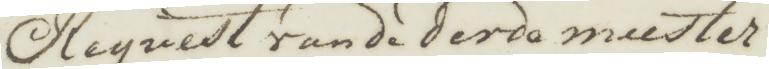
Request van de derde meester
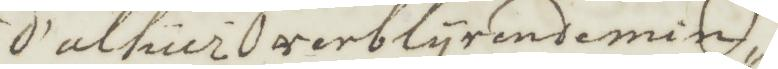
d’ alhier Over blijven de min„
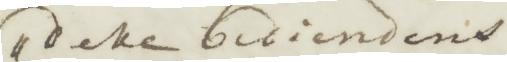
„dere bediendens
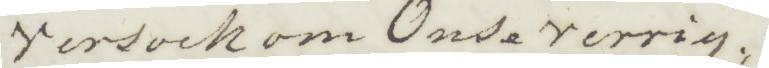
Versoek om Onse verrig„
